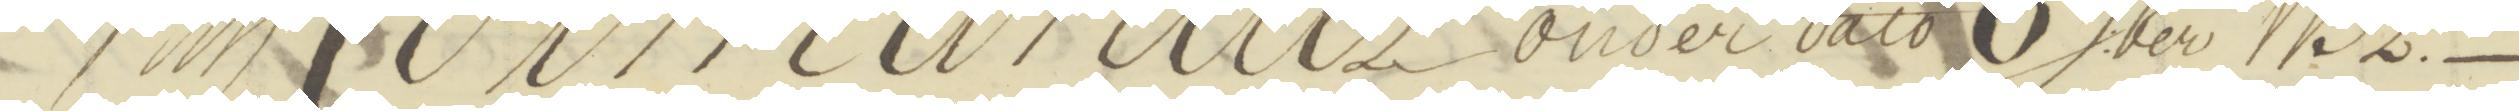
Van Cormandel onder dato 6 Jber 1732.—
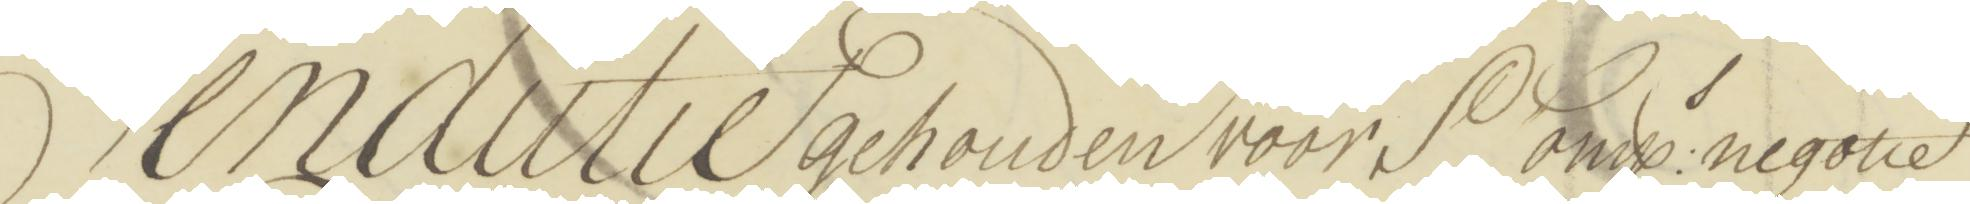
Vendutie gehouden voor s Comp:s negotie
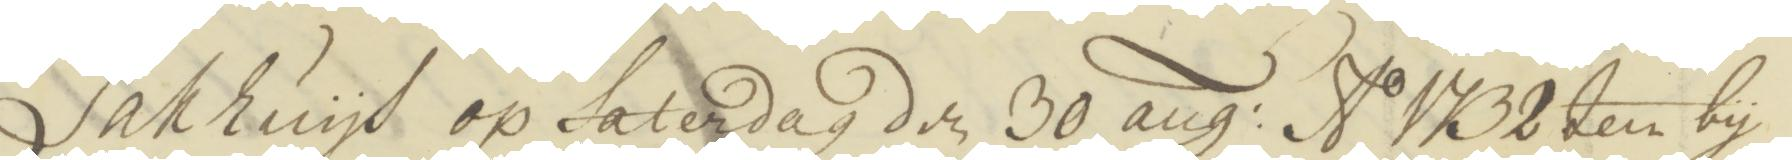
Pakhuijs op saterdag den 30 aug: Ao 1732 ten bij
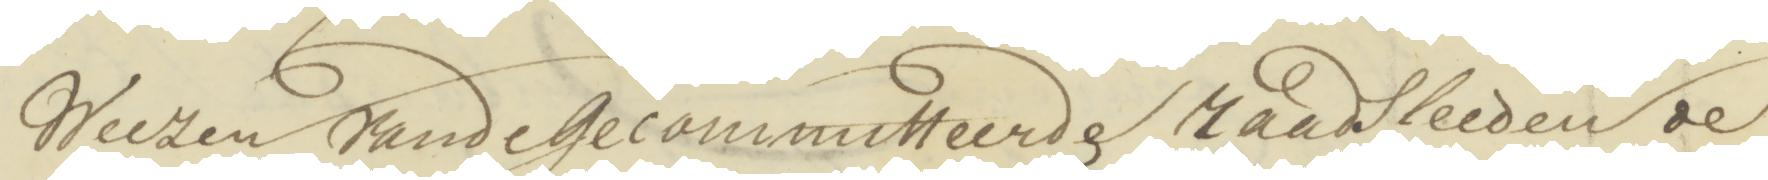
weezen vande gecommitteerde raadsleeden de
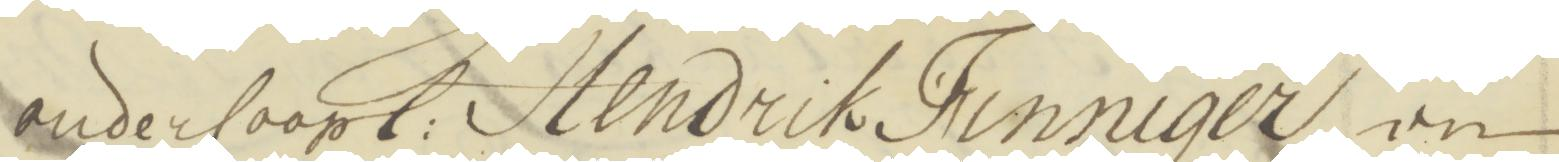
onder Coopl: Hendrik Finniger en
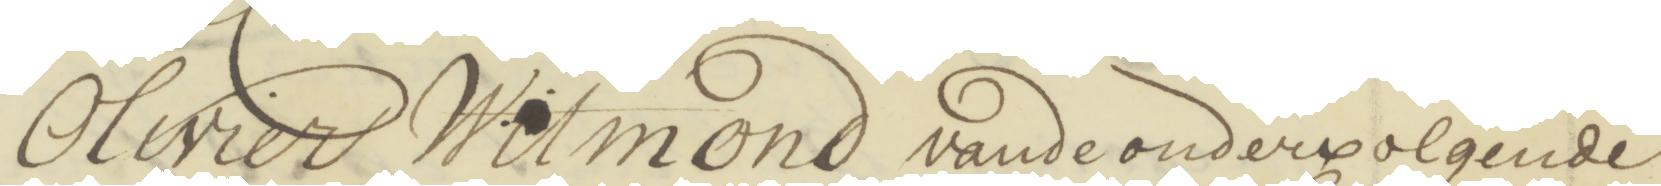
Olivier Witmond van de ondervolgende
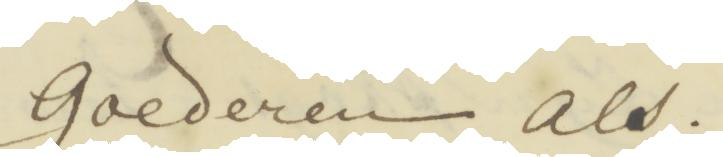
goederen als.
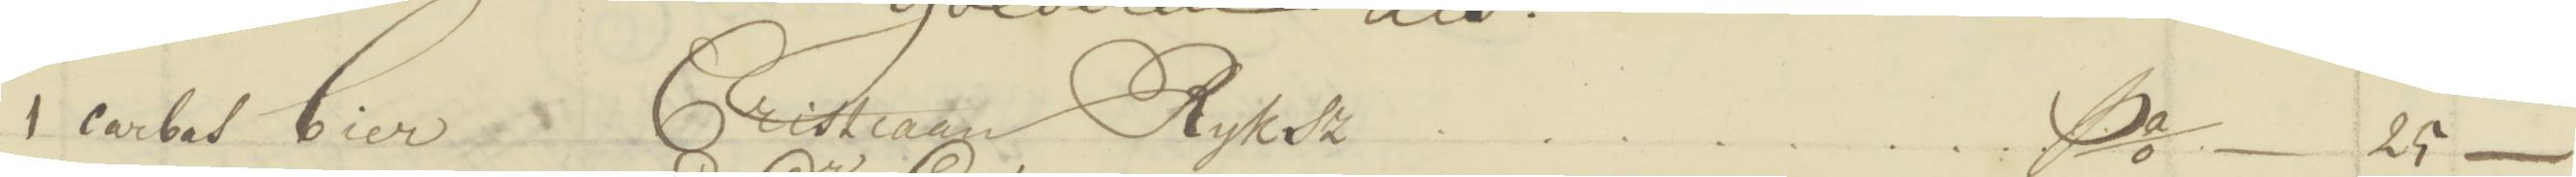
1 carbas bier Cristiaan Ryksz . . . . . . . . . p a/o — 25 —
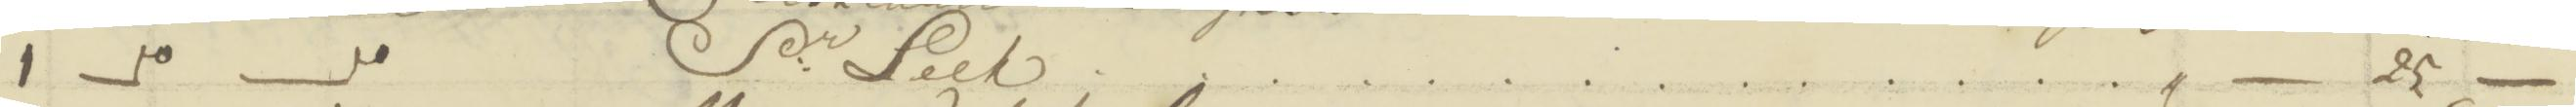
1 _o _o S:r Leek . . . . . . . . . . . . . . „ — 25 —
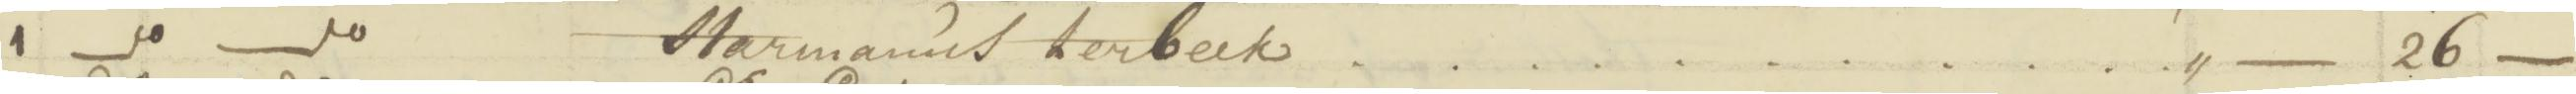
1 _o _o Harmanus terbeek . . . . . . . . . . . „ — 26 —
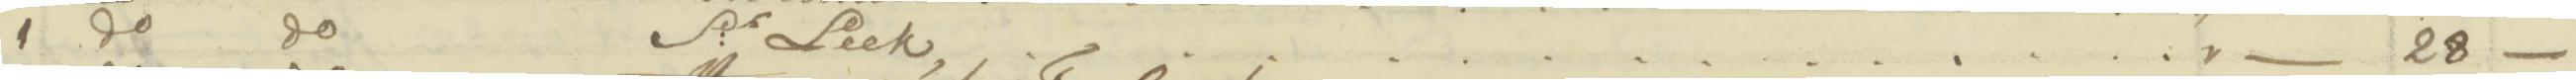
1 do do S:r Leek . . . . . . . . . . . . . . „ — 28 —
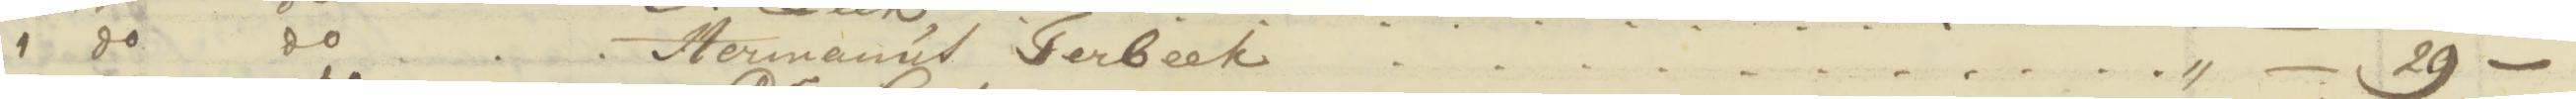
1 do do . . . Harmanus Terbeek . . . . . . . . . . . „ — 29 —
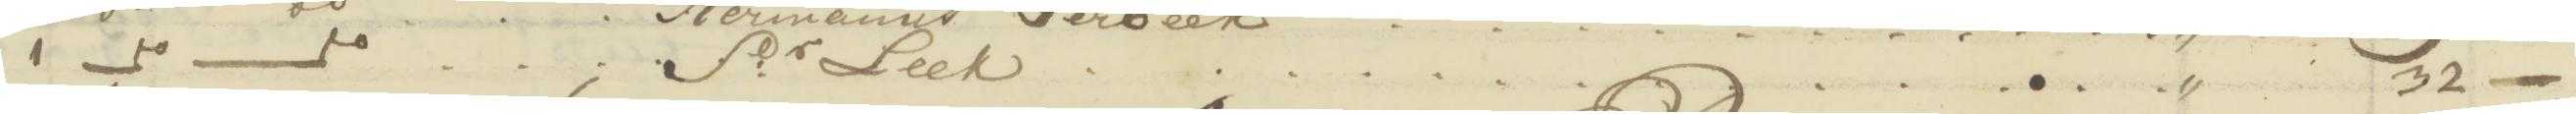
1 _o _o . . . . S:r Leek . . . . . . . . . . . . . . . . „ 32 —
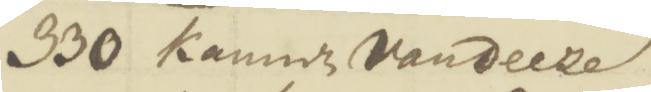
330 kannen van deeze
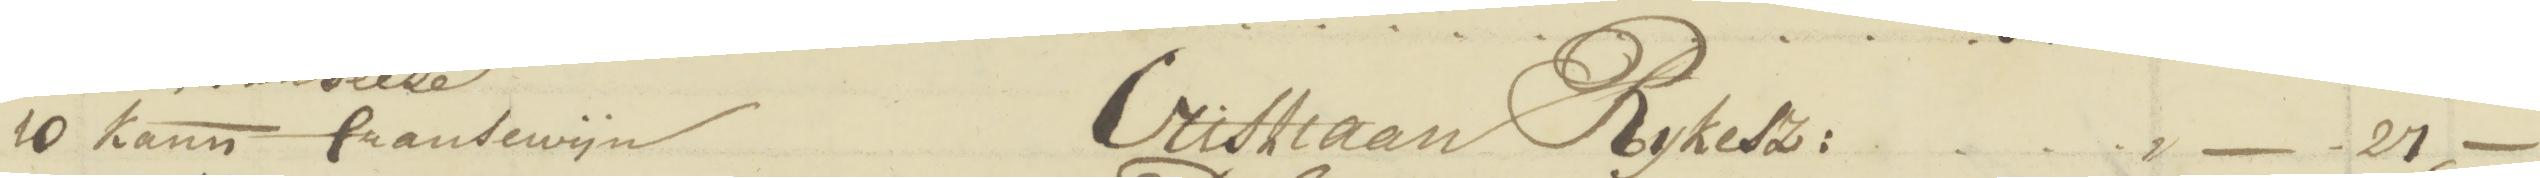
10 kann fransewijn Cristiaan Rykesz: . . . . „ — -27 —
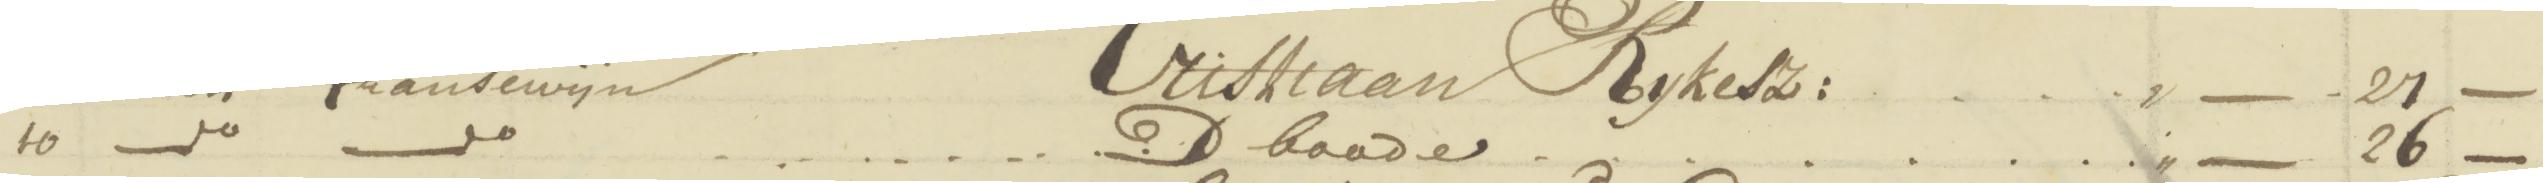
10 _o _o . . . . . - - . .D boode . . . . . . . . „ — 26 —
